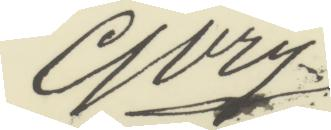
GVrij
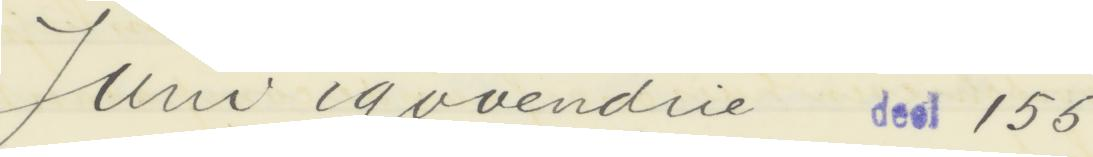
Juni 1900endrie
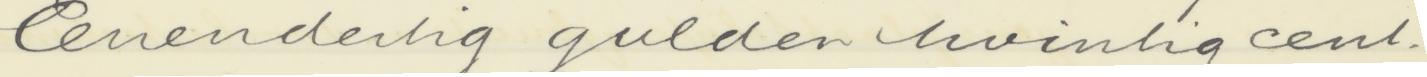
Eenendertig gulden twintig cent.
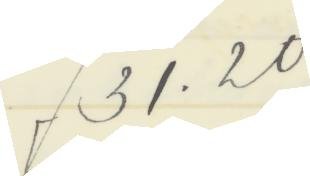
ƒ31.20
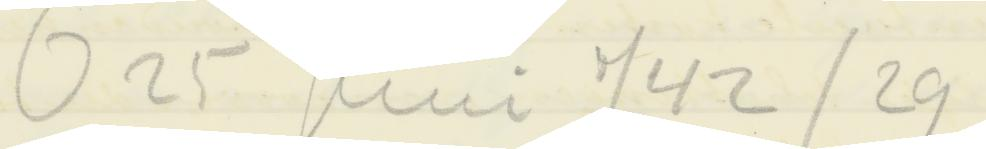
O 25 Juni 742 / 29
